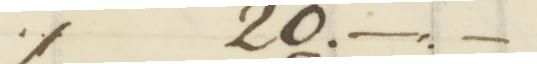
-„ 20.—.—
